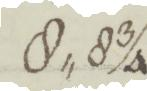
8„ 8¾
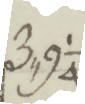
3„9¼
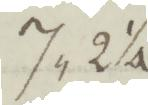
7„ 2¼
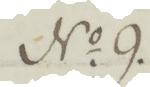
N-.o 9.
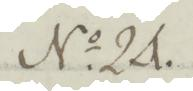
N-.o 24.
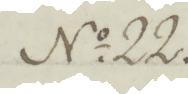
N-.o 22.
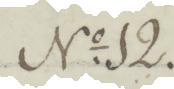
N-.o 12.
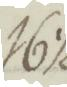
16 1/
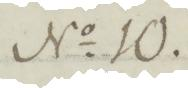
N-.o 10.
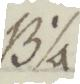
13¼
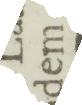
L dem
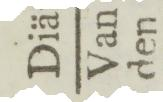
Diä Van den
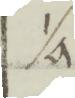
¼
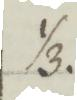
1/3.
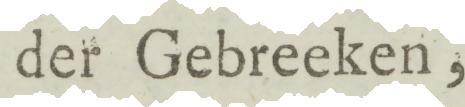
der Gebreeken,
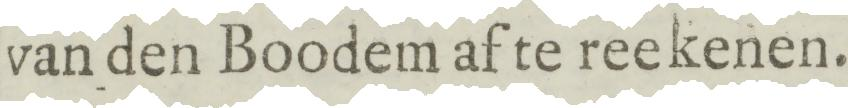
van den Boodem af te reekenen.
